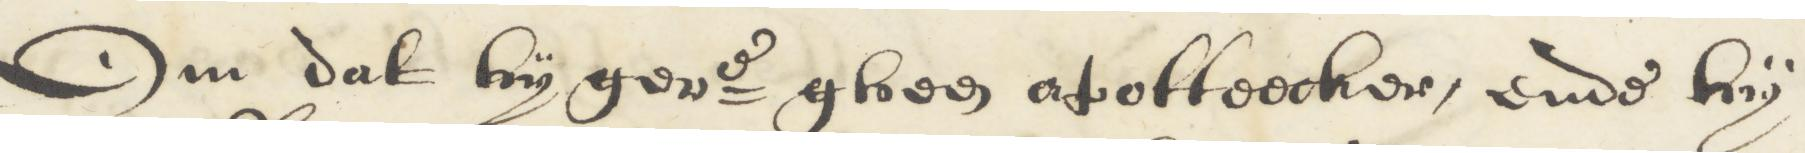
Om dat hij gev=e gheen apotteecker, ende hij
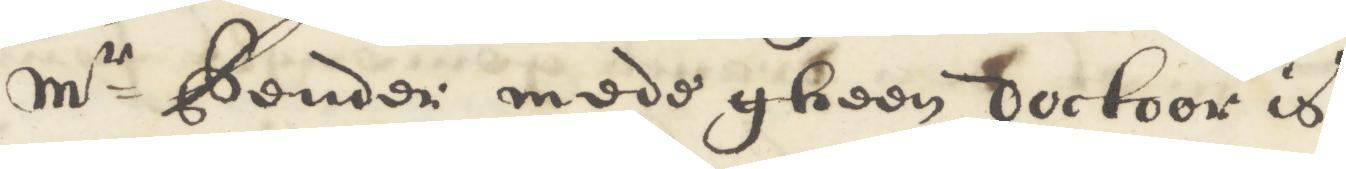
m=r Bender mede gheen doctoor is
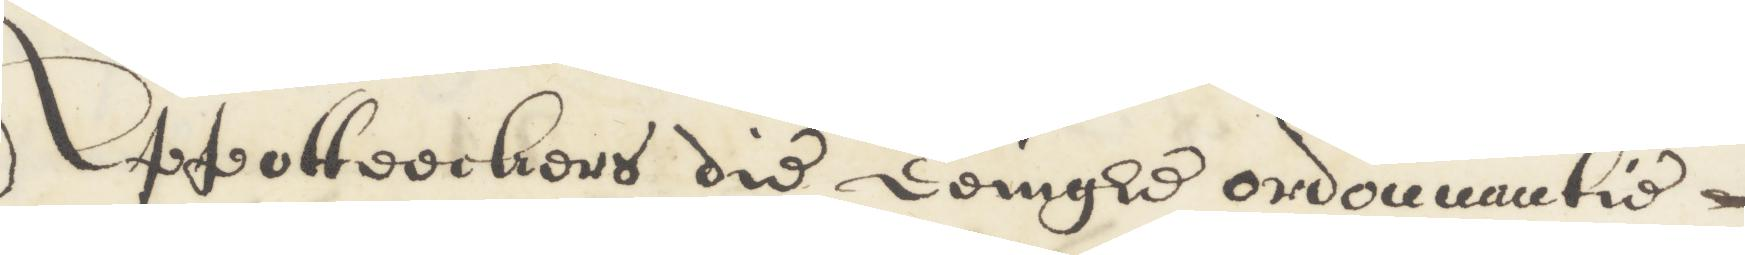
Appotteeckers die Eenighe ordonnantie
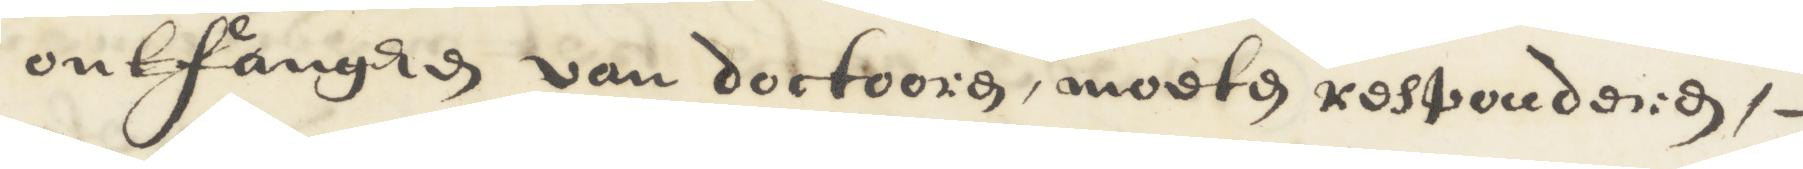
ontfanghen van doctooren, moeten responderen/
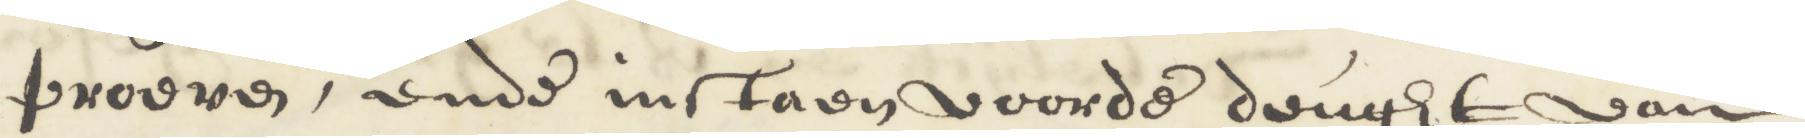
proeven, ende instaen voorde deught van
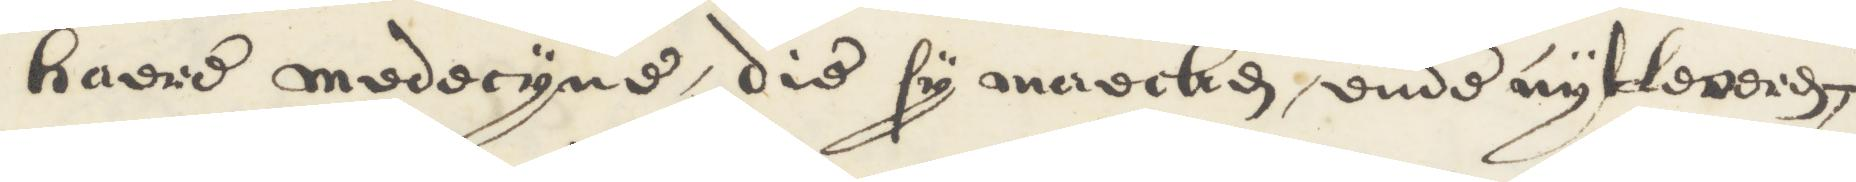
haere medecijne, die sij maecken, ende uijtleveren
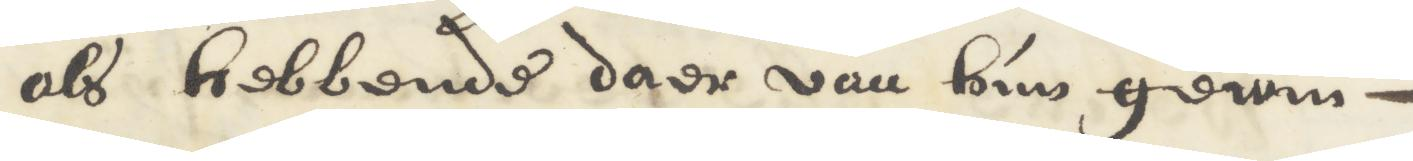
als hebbende daer van hun gewin
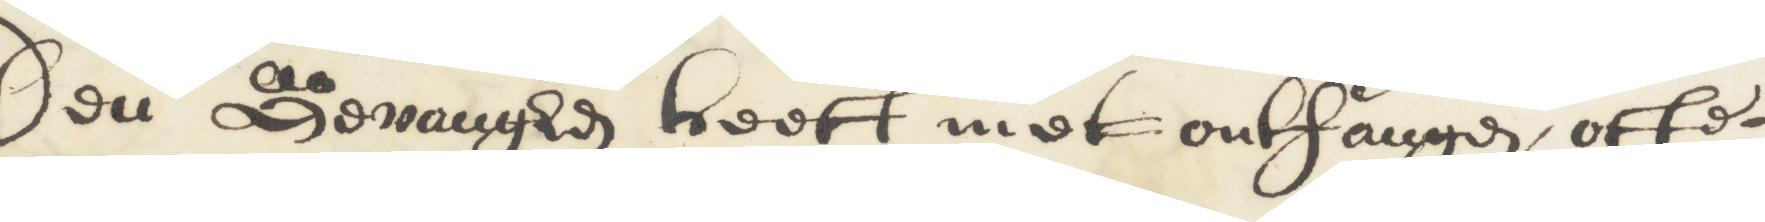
Den Gevanghen heeft niet ontfangen, offe
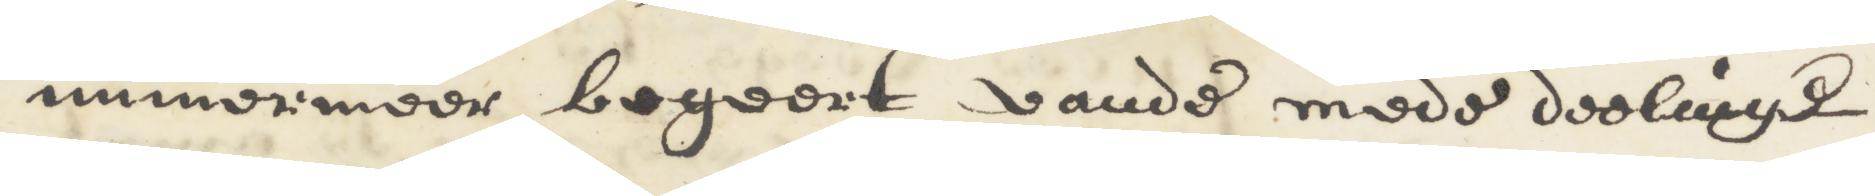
immer meer begeert vande mede deelinge
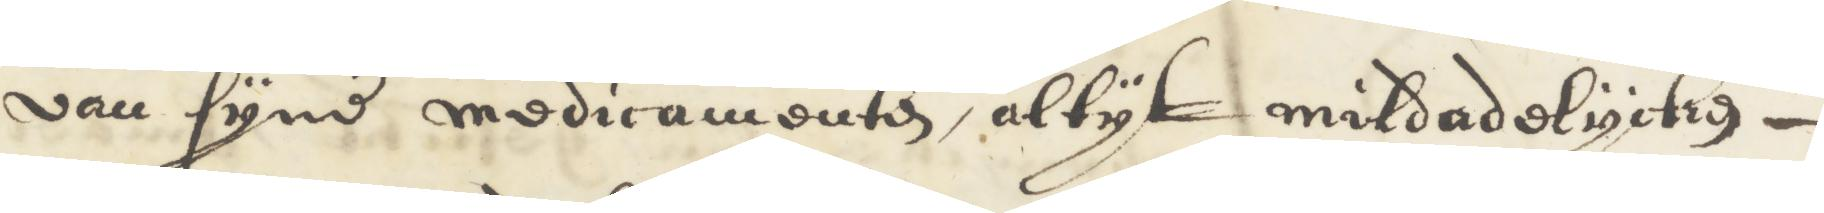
van sijne medicamenten, altijt mildadelijcken
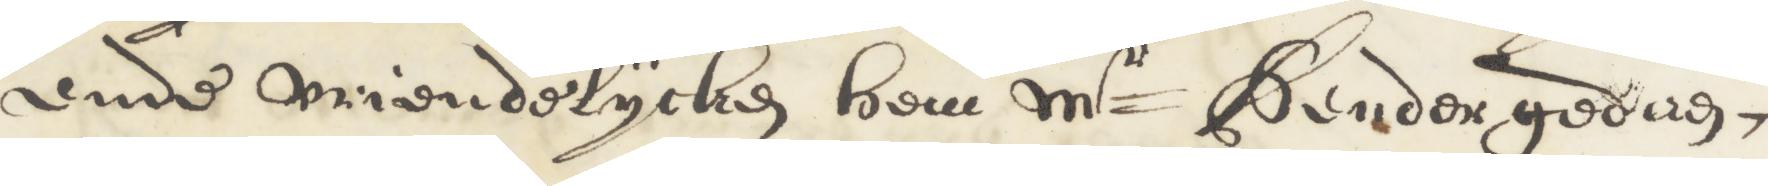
ende vriendelijcken hem m=r Bender gedaen,
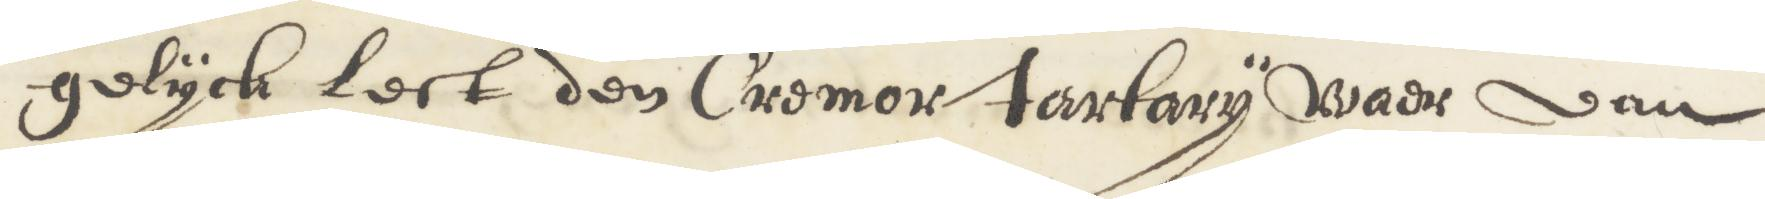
gelijck lest den Cremor tartarij waer van
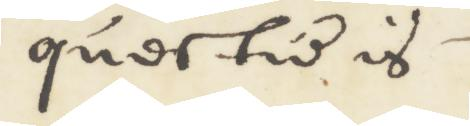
questie is
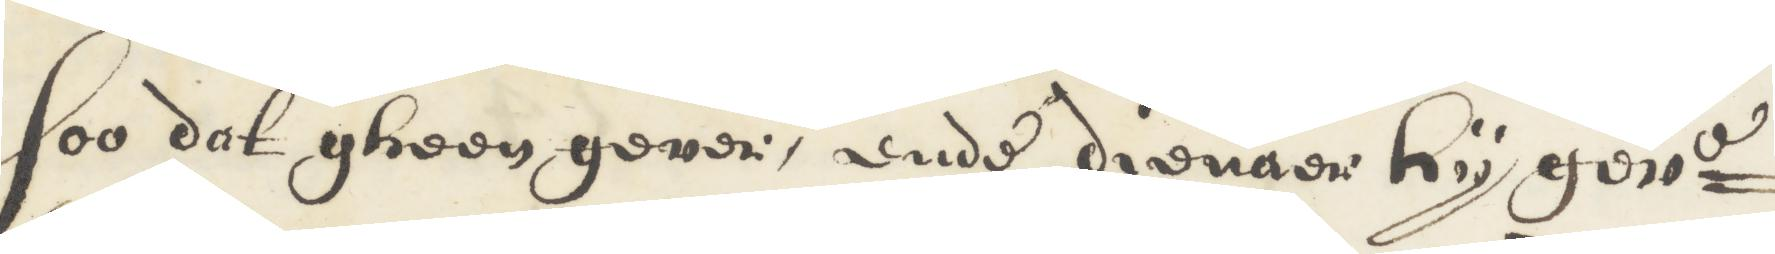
Soo dat gheen gever, ende dienaer hij gev=e
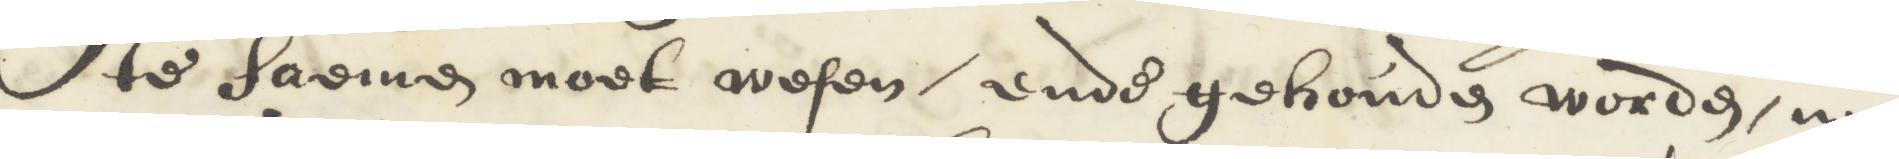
te saemen moet wesen, ende gehouden worden, in
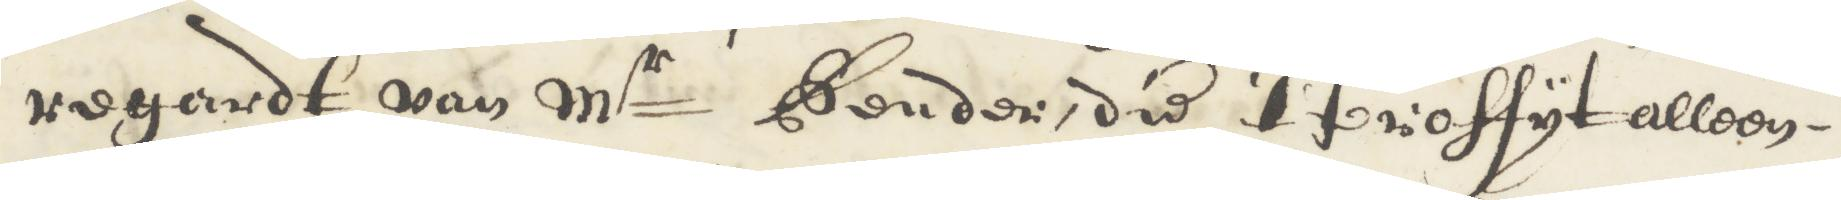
regardt van m=r Bender, die ’t proffijt alleen
